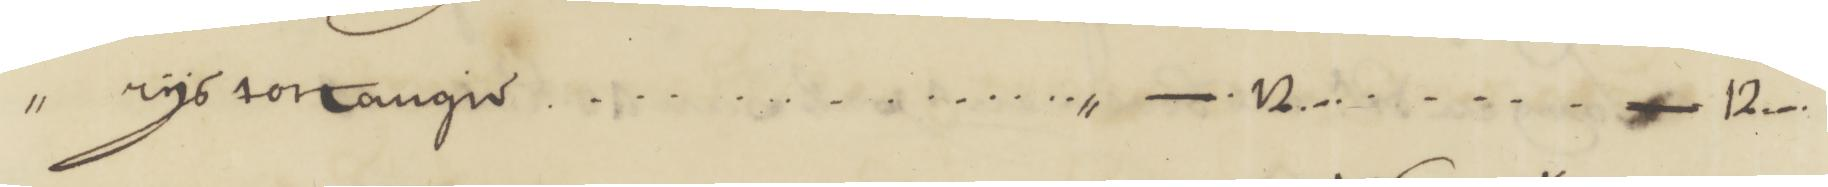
„ rijs tot cangie . . . . . . . . . . . . . . . „ —.12.-. . . . . . 12.-.
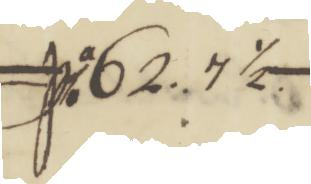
p a/o 62:7.½.
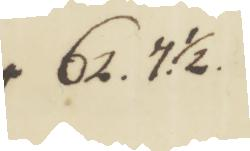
62. 7.½.
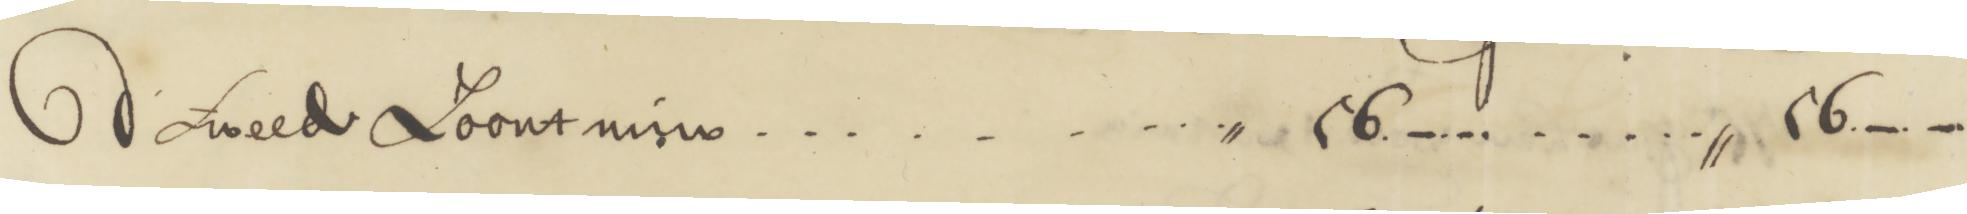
d' tweede Zoort min . . . . . . . . . „ 56.—.—. . . . . . „ 56.—.—
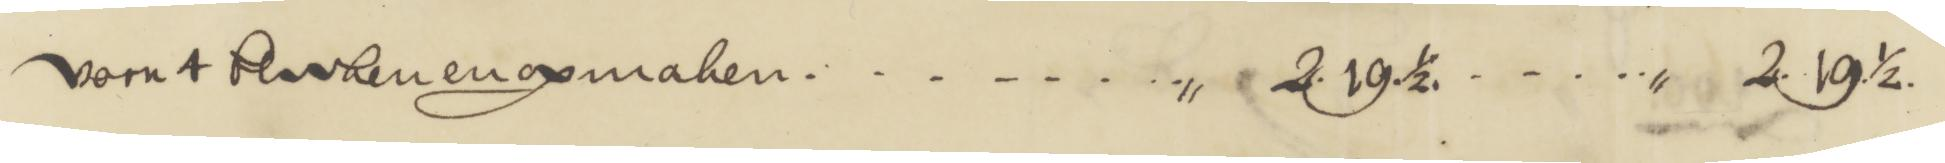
voor t bleeken en opmaken . . . . . . . . „ 2.19.½ . . . . . . „ 2.19½.
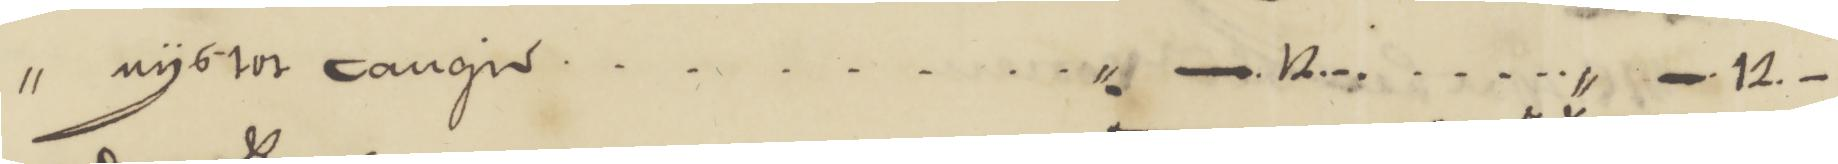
„ rijs tot cangie . . . . . . . . „ —.12.—.. . . . . „ —.12.—
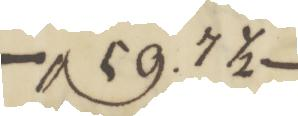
„ 59.7½
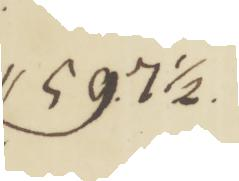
59.7½.
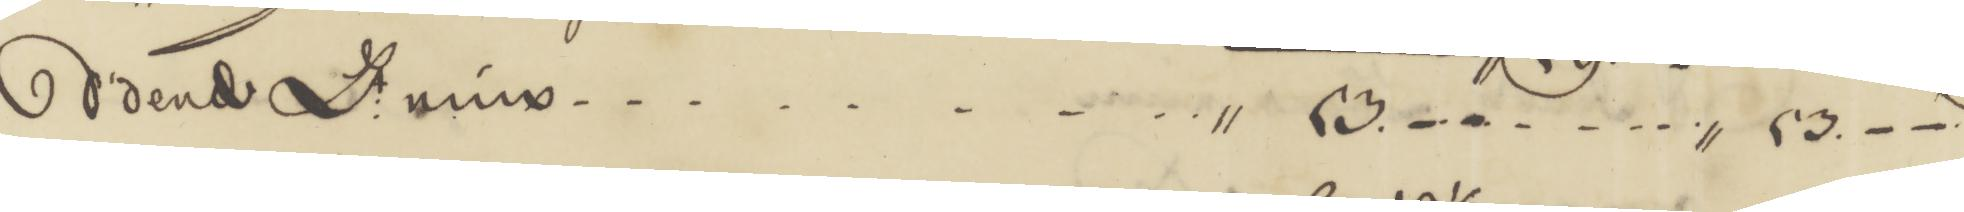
d'derde Z:t ruw . . . . . . . . . „ 53.—.— . . . . . „ 53.— —.
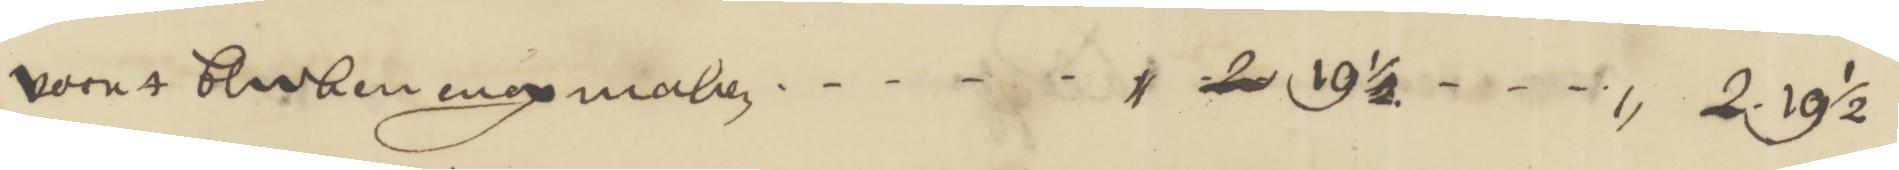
voor t bleeken en opmalen . . . . . „ 2 19½ . . . . „ 2.19½
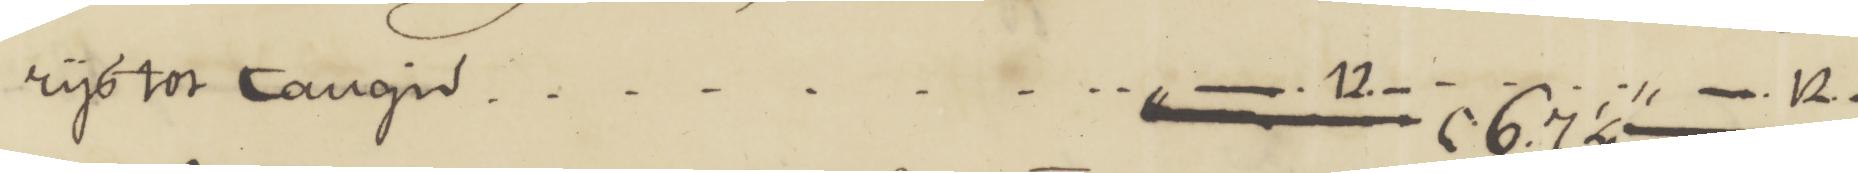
rijs tot Cangie . . . . . . . . „ —.12.— . . . . „ —. 12.
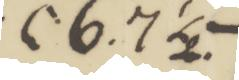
56.7½.
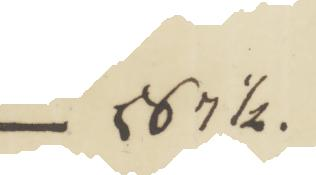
56 7½.
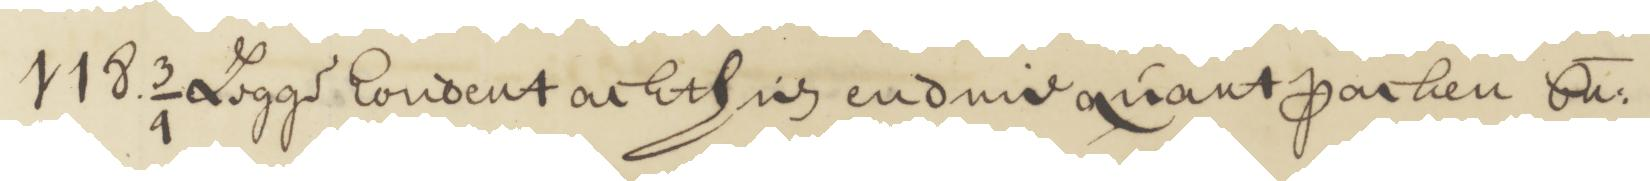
118.¾ Zegge hondert achthien en drie quart packen br:
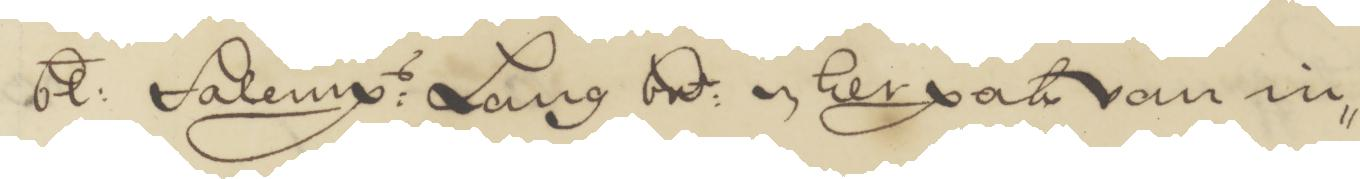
bl: Salemp:s Lang br:t en het pak van in
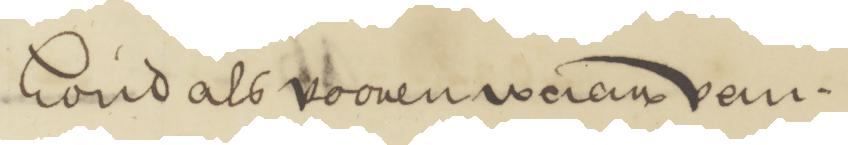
houd als vooren waar van.
